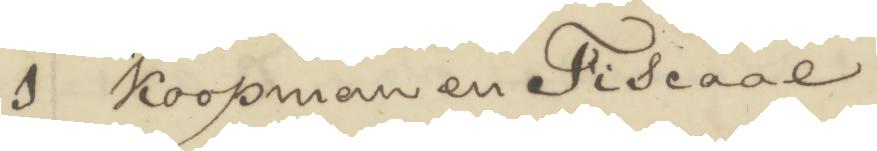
1 koopman en Fiscaal
